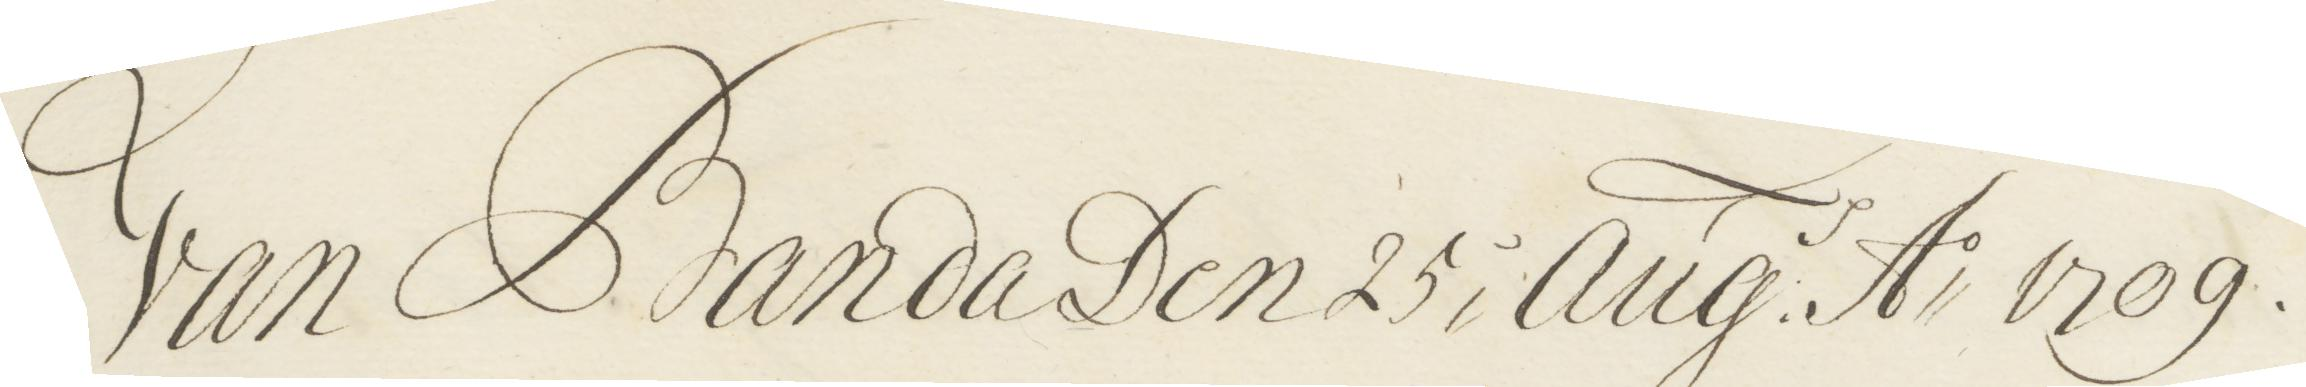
Van Banda Den 25„' Aug: A„o 1709.
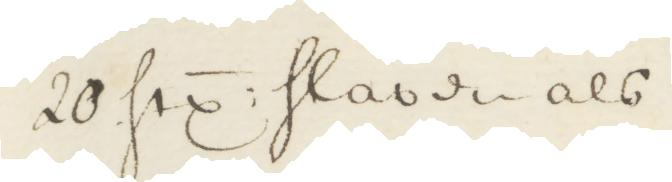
20 stx: slaven als
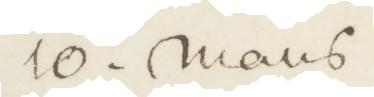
10. mans
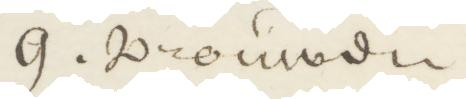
9. vrouwen
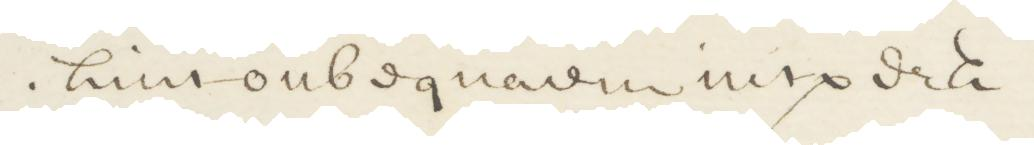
1. kint onbequaem in't perk
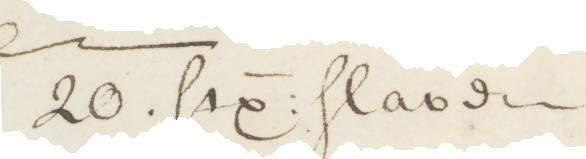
20. stx: slaven
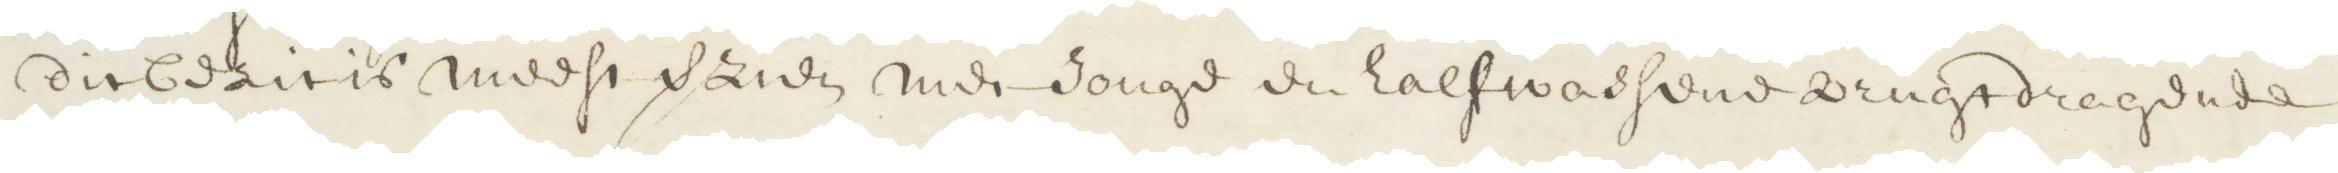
dit bezit is meest verzien met Ionge en halfwassene vrugtdragende
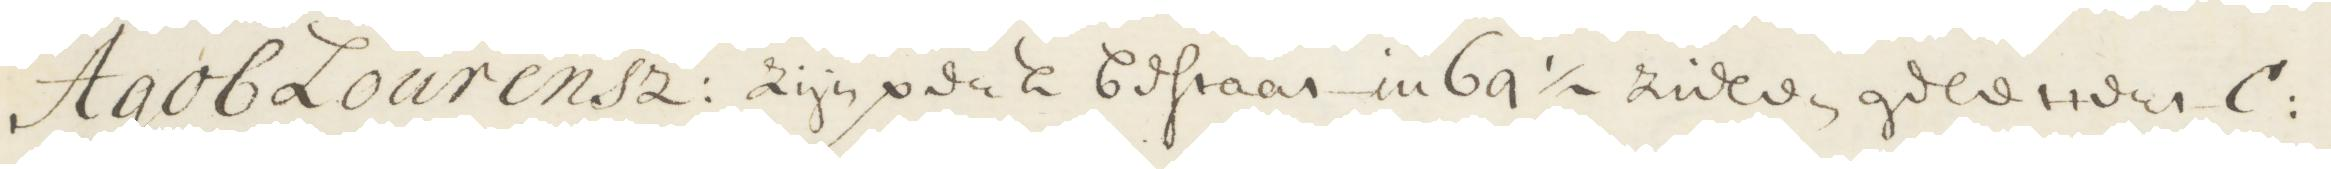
Agob Lourensz: zijn perk bestaat in 69½ zielen gelettert C:
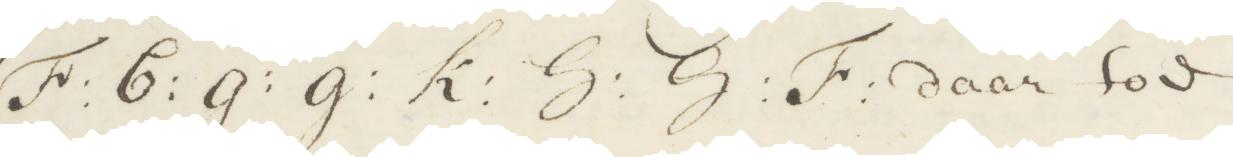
F: b: g: g: k: h: h: F: daar toe
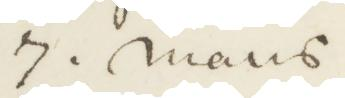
7. mans
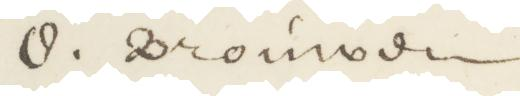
8. vrouwen
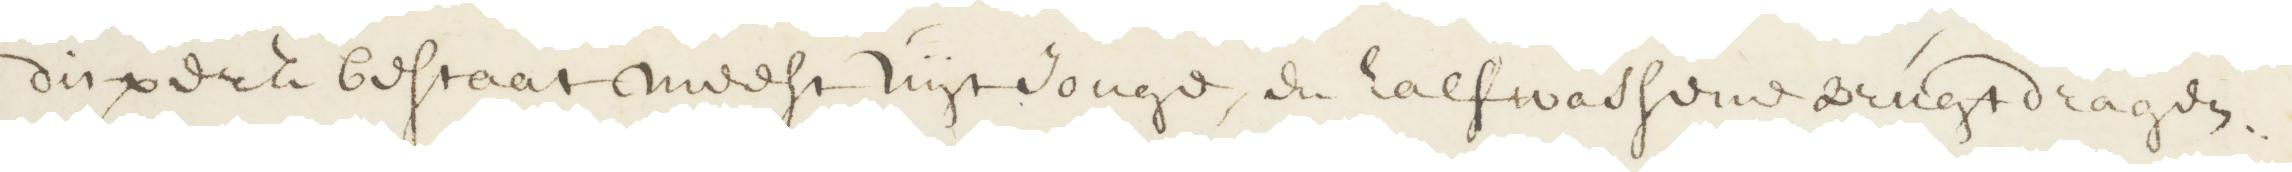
dit perk bestaat meest uijt Ionge, en halfwassene vrugtdragen„
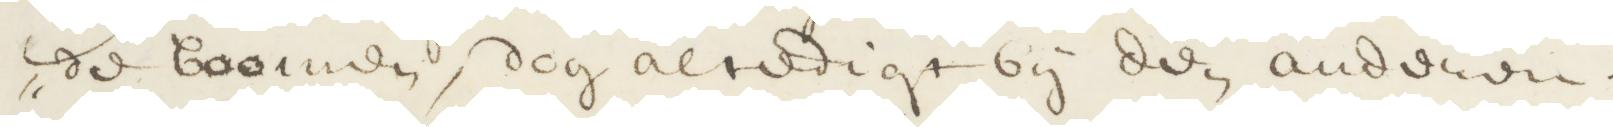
„de boomen, dog altedigt bij den anderen
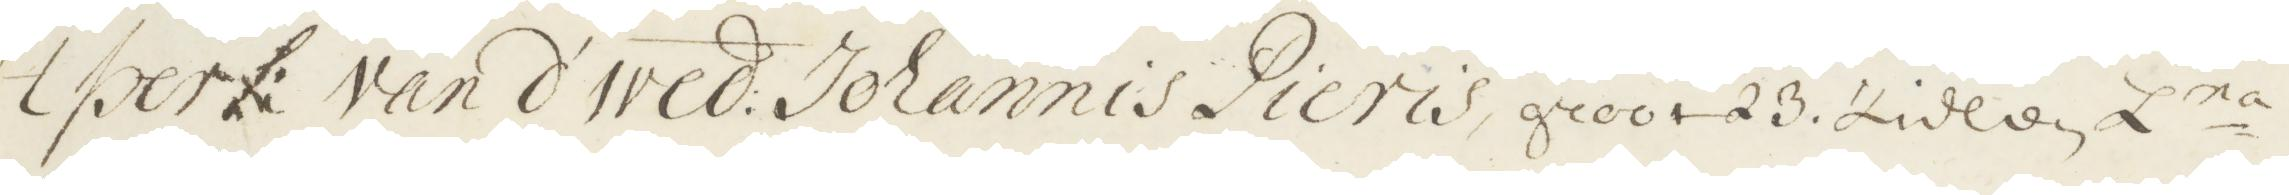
t perk van d’ wed: Iohannis Pieris, groot 23. Zielen L=ra
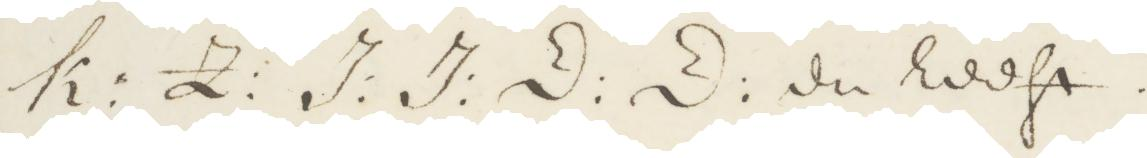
k: z: I: I: E: E: en heeft
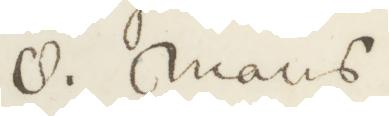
8. mans
